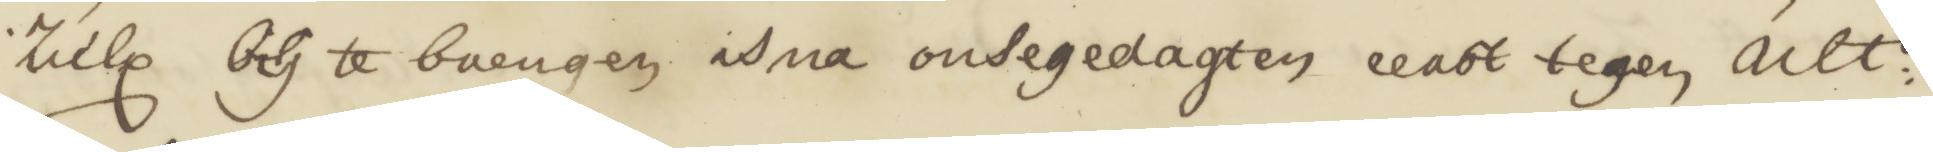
Zulx bij te brengen is na onse gedagten eerst tegen Ult„o
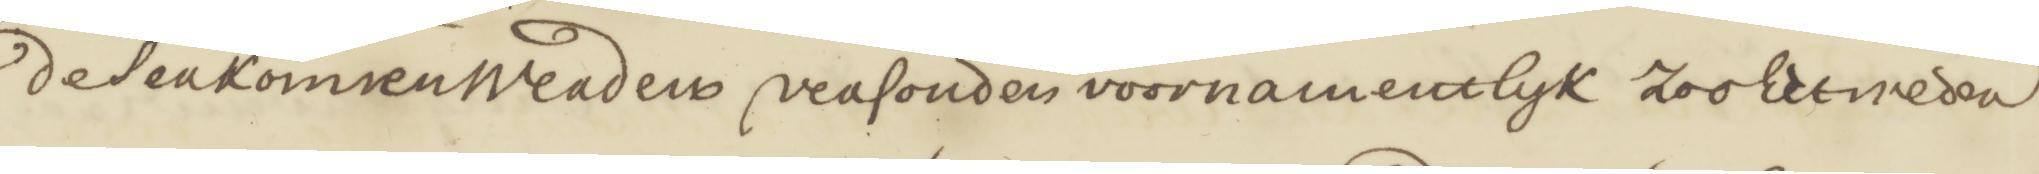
deser konnen werden versonden voornamentlyk zoo het weder
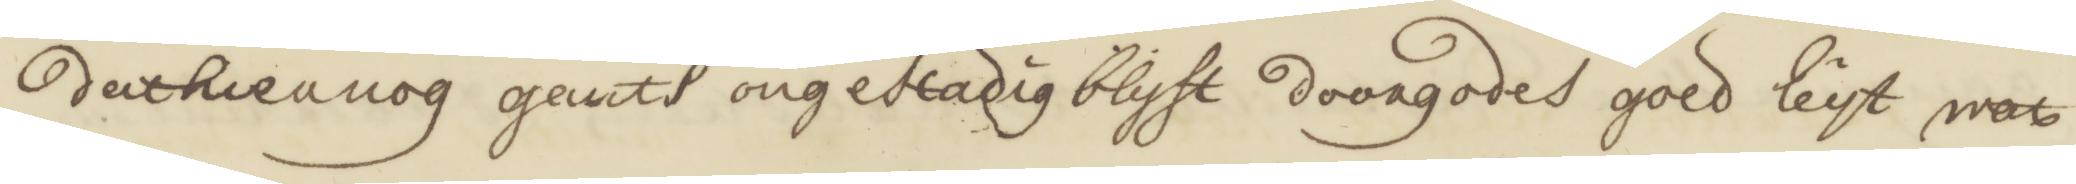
dat hier nog gants ongestadig blijft door godes goed heijt wat
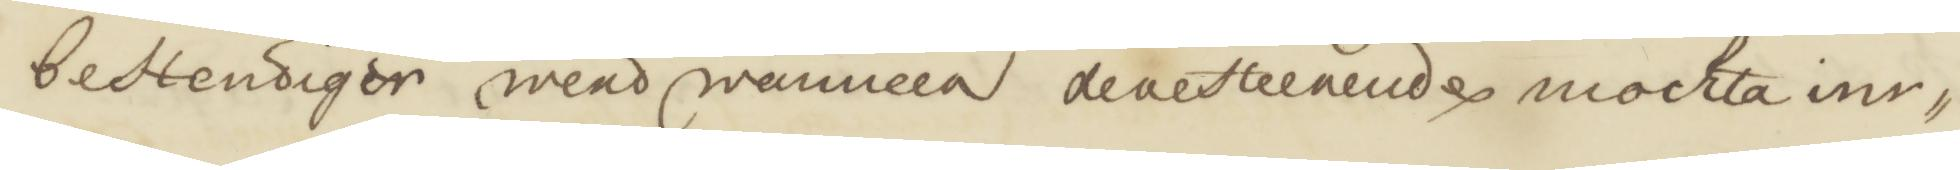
bestendiger werd wanneer de resteerende mochta im„
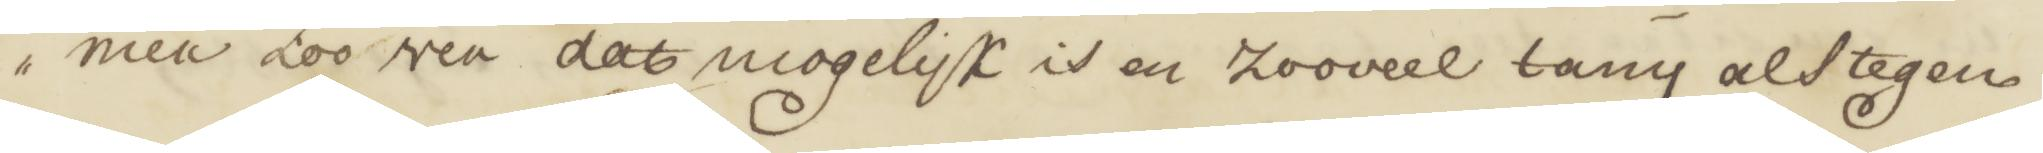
„ mer Zoo ver dat mogelijk is en Zooveel tany als tegen
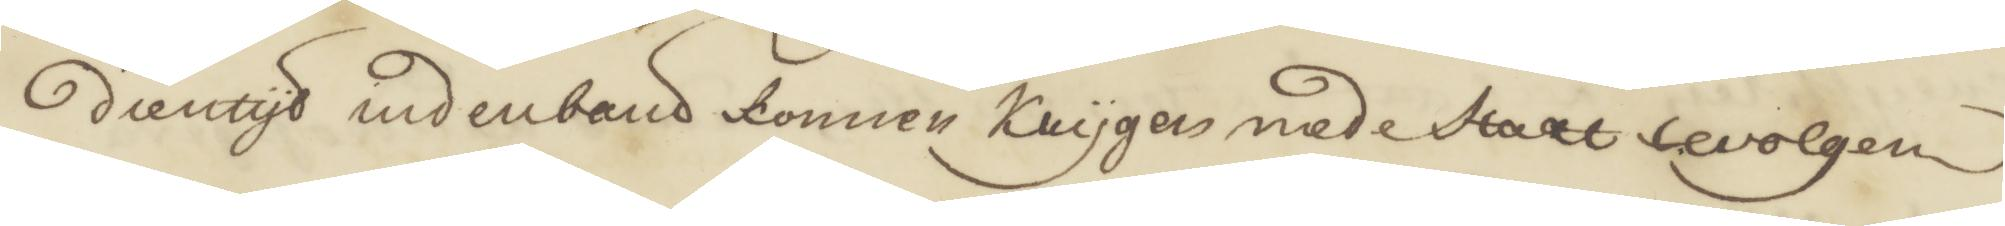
dientijd indenband konnen krijgen mede staat tevolgen
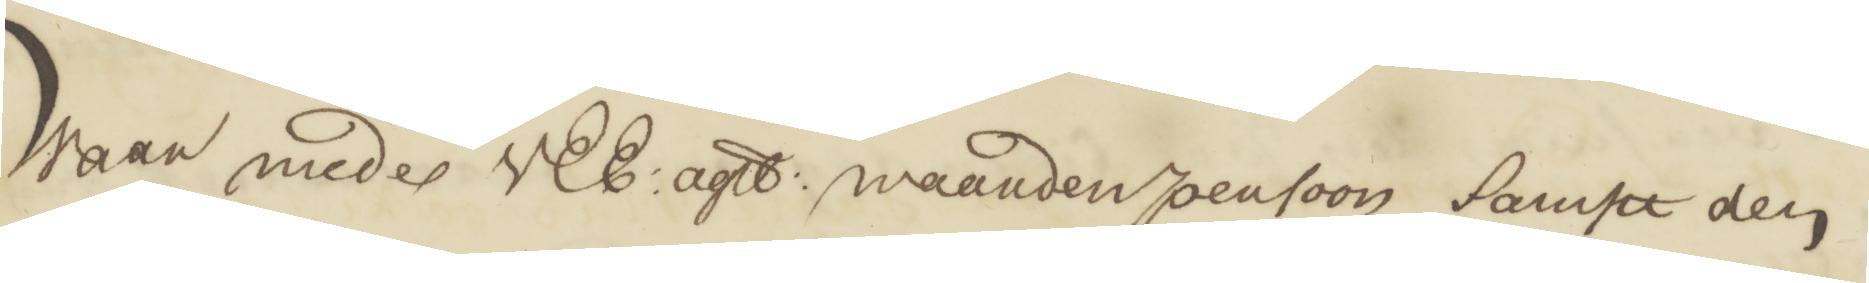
Waar mede VEE: agtb: waarden persoon Sampt den
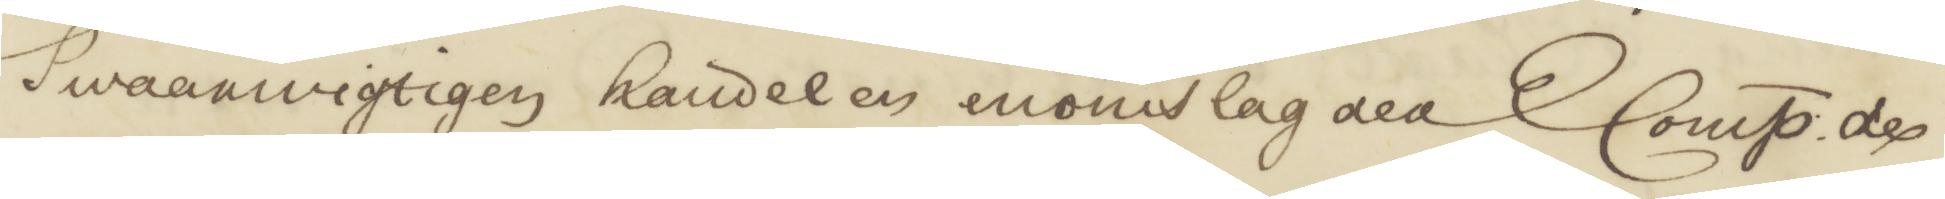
Swaarwigtigen handel en en omslag der EComp: de
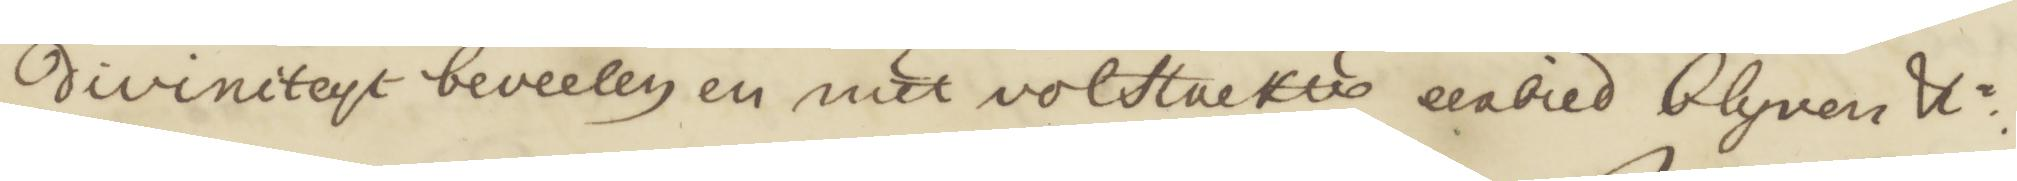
diviniteijt beveelen en met volstrekte eerbied blyven &c.a
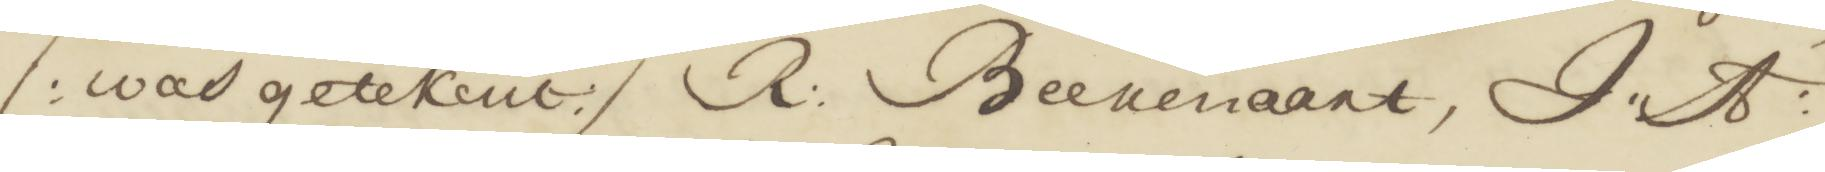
/: was getekent:/ R: Beerenaart, I A:
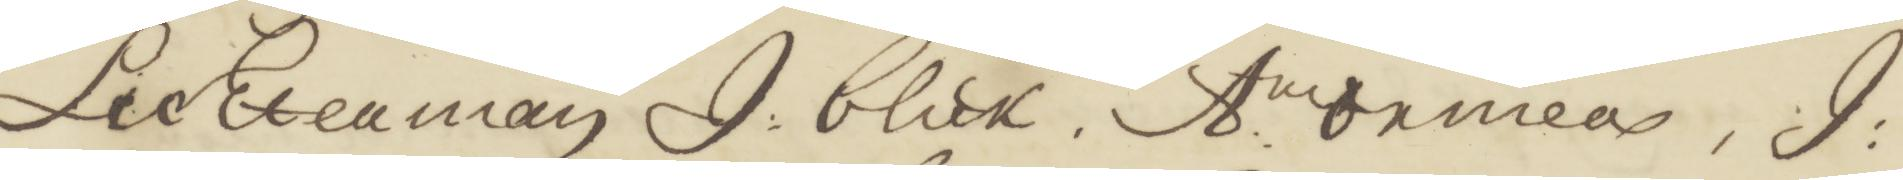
Sichterman J: bliek, A:m Ormea, I:
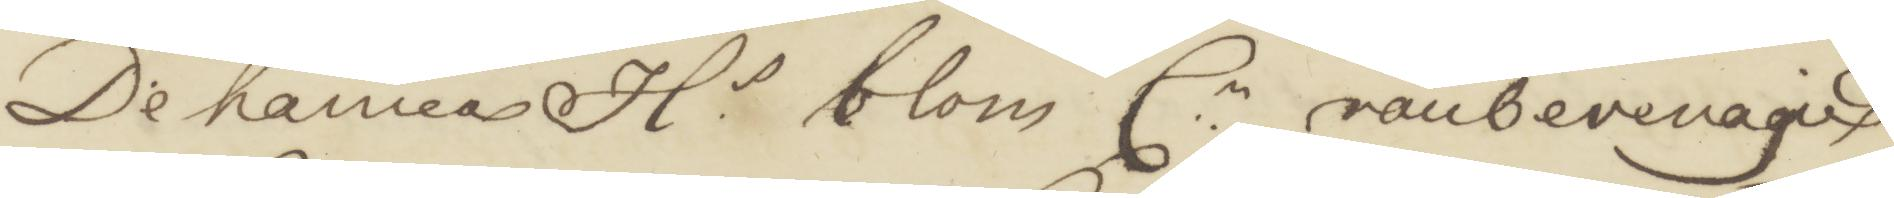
De hamer H:s blom C:n van bevenagie
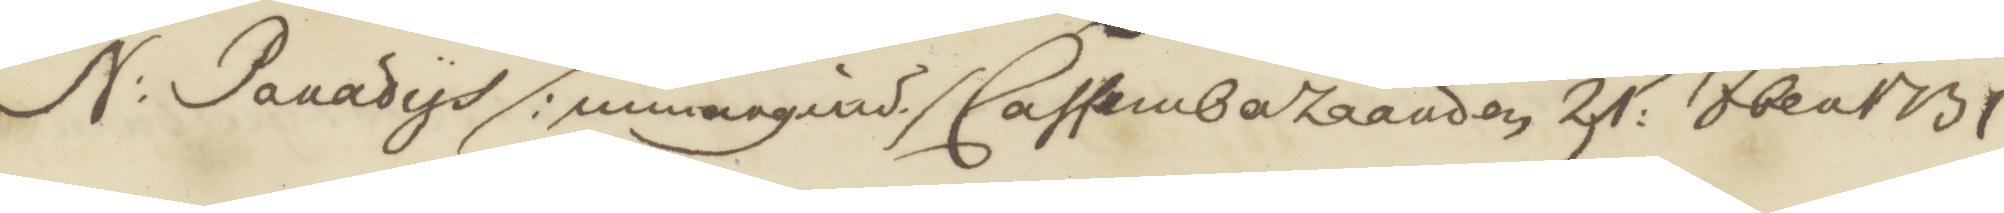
N: Paradijs /:inmargine:/ Cassembazaar den 21:' 8ber 1731
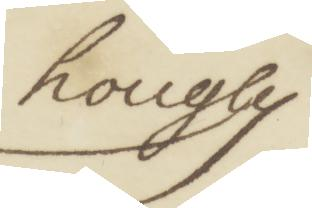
hougly
